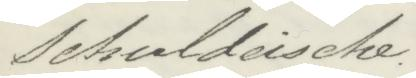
schuldeische.
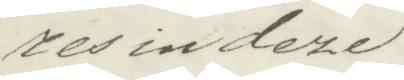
res in deze
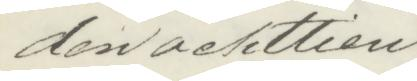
den achttien
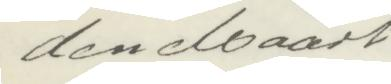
den Maart
